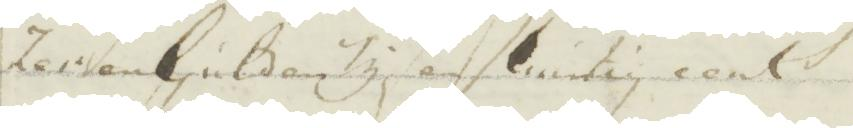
Zerven Gulden vijf en twintig cents
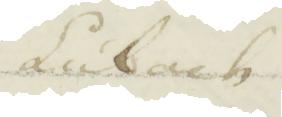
Lubach
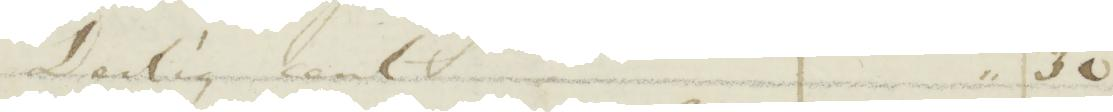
Dertig cents „ 30
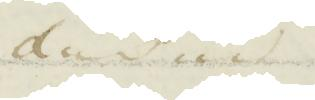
du Puit
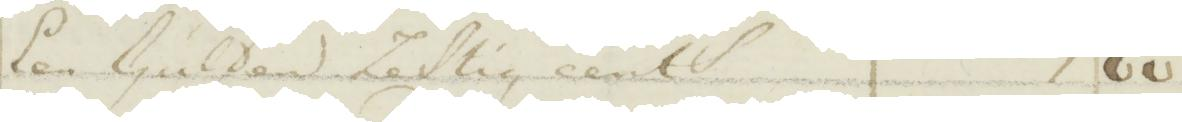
Een Gulden Zestig cents 1 60
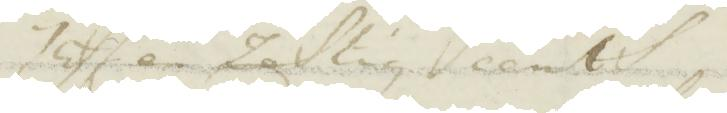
vijf en Zestig cents
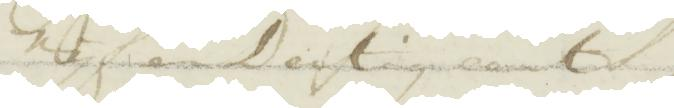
vijf en Dertig cents
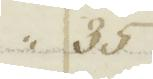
„ 35
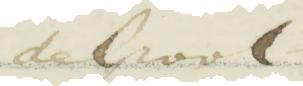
de Groot
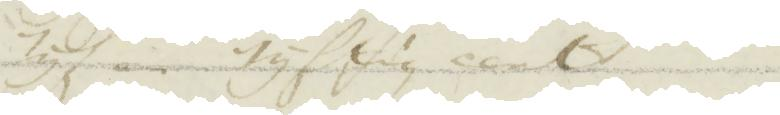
vijf en vijftig cents
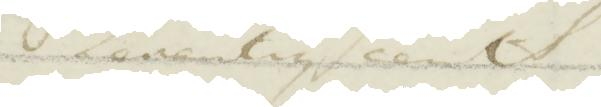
Zeventig cents
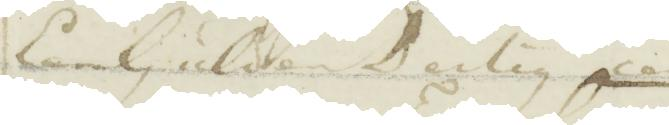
Een Gulden Dertig cents
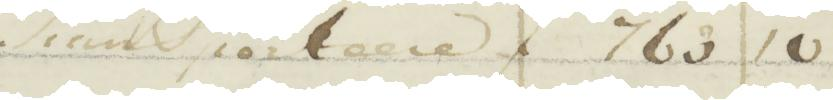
Transporteere ƒ 763 10
